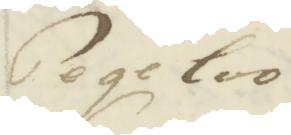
Pegeloo
